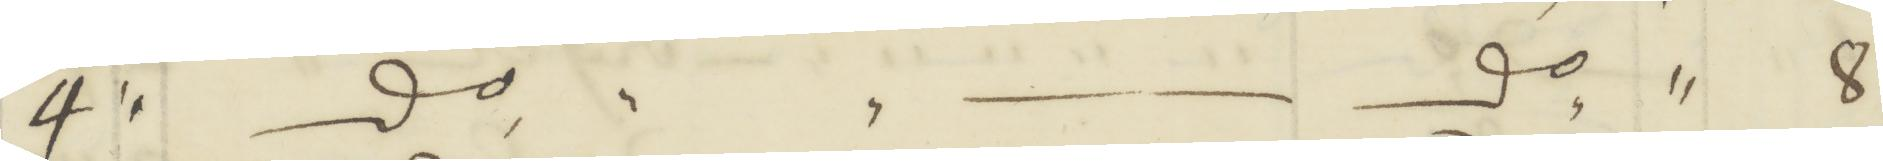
4„ _,o „ „ — — d„o „ 8
